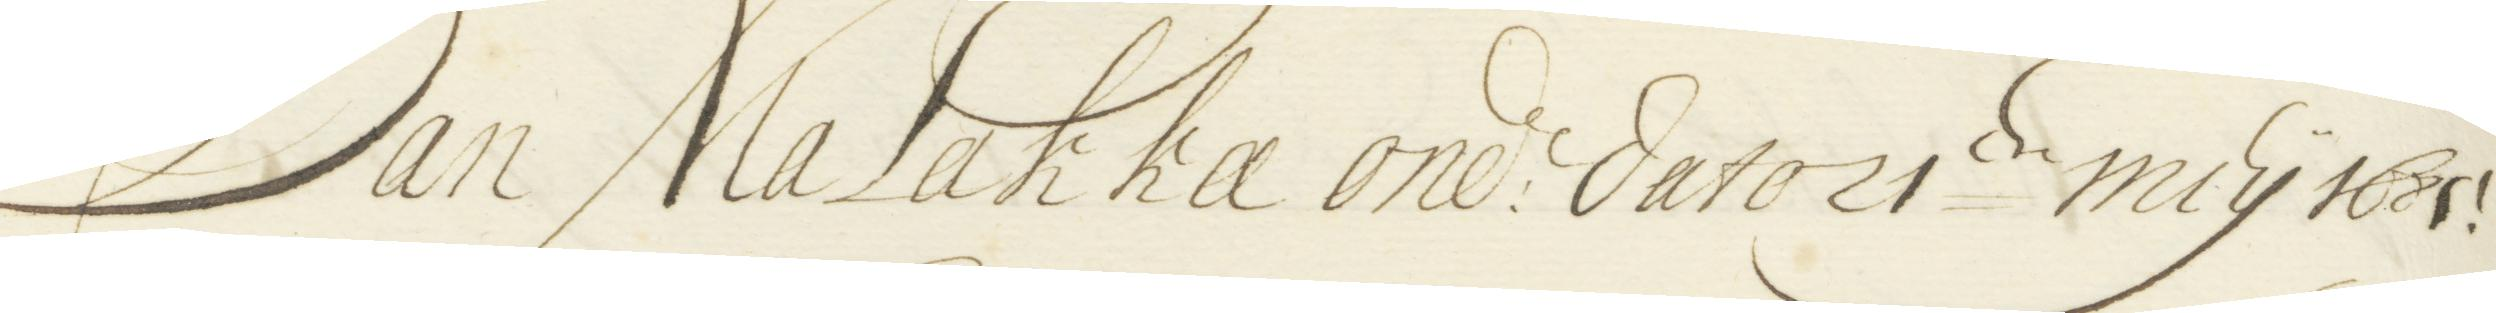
Van Malakka ond:r dato 21=en meij 1685:
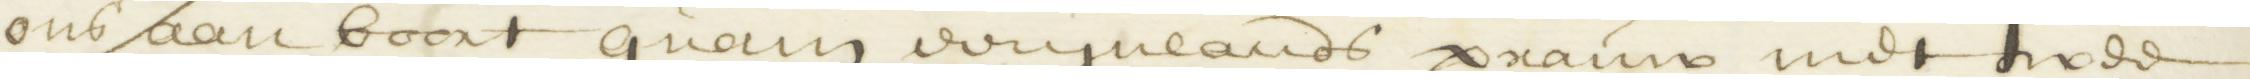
ons aan boort quam eenjnlands prauw met twee
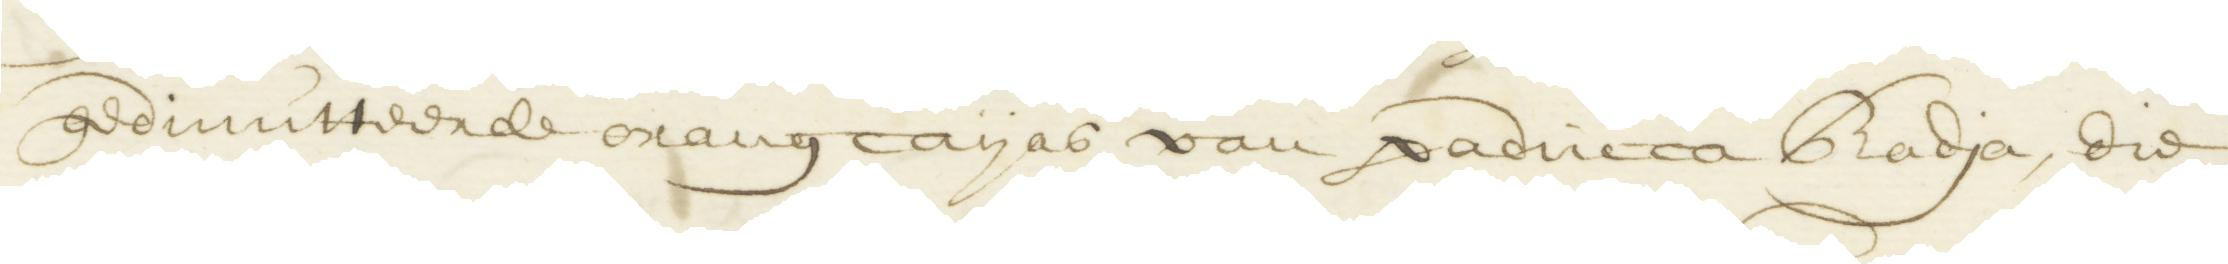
gedimitteerde orangcaijas van paducca Radja, die
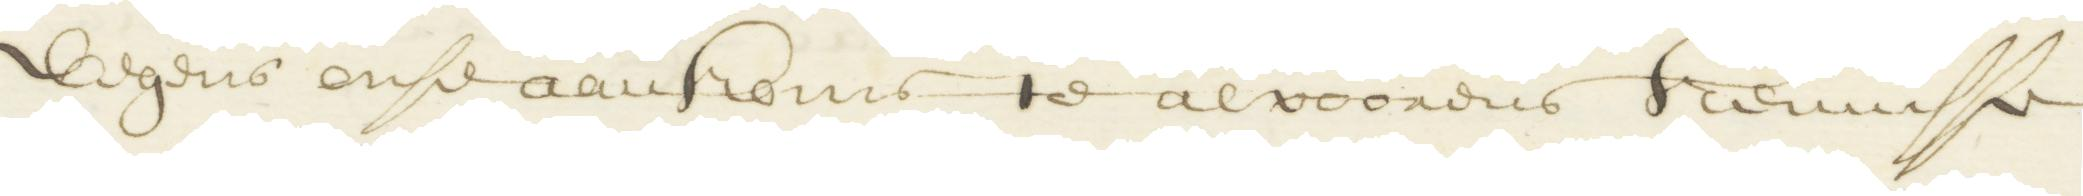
wegens onse aankomste alvoorens kennisse
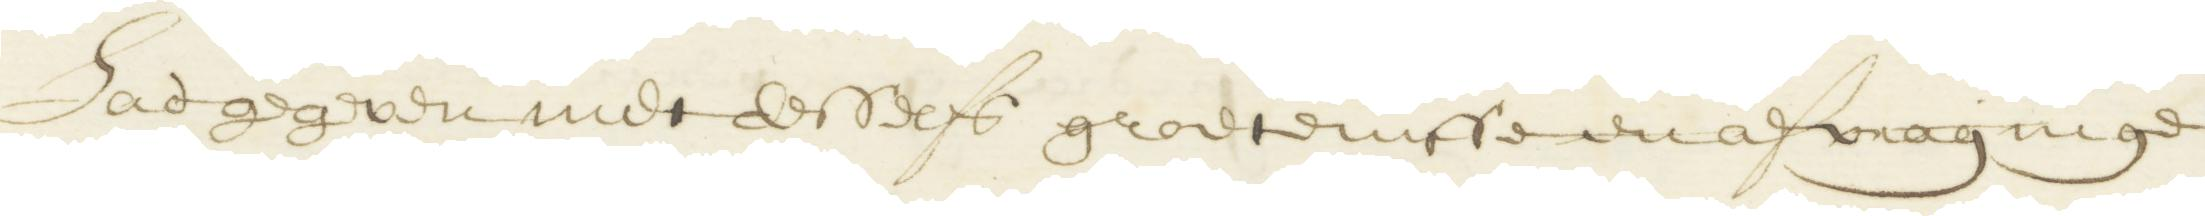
had gegeven met desselfs groetenisse en afvraginge
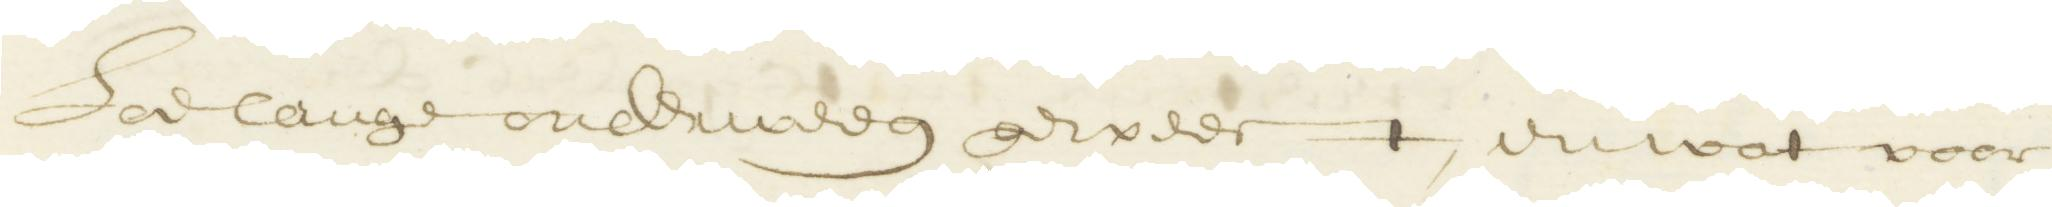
hoelange onderweeg geweest, en wat voor
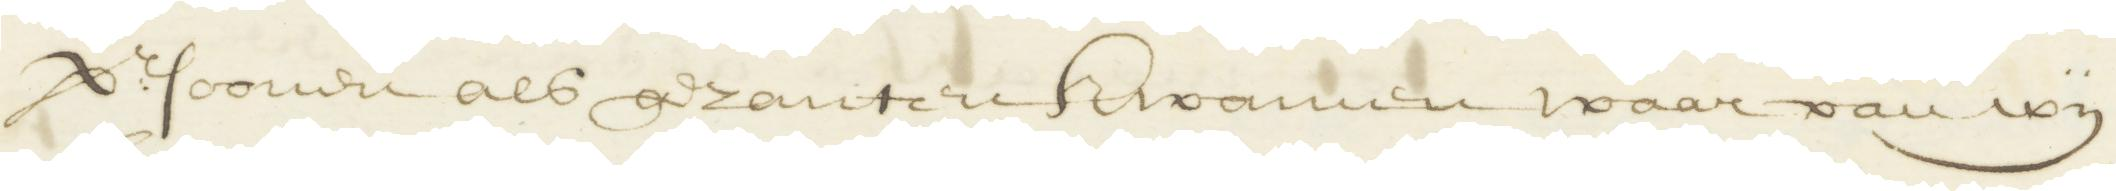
p:rsoonen als gezanten kwamen waar van wij
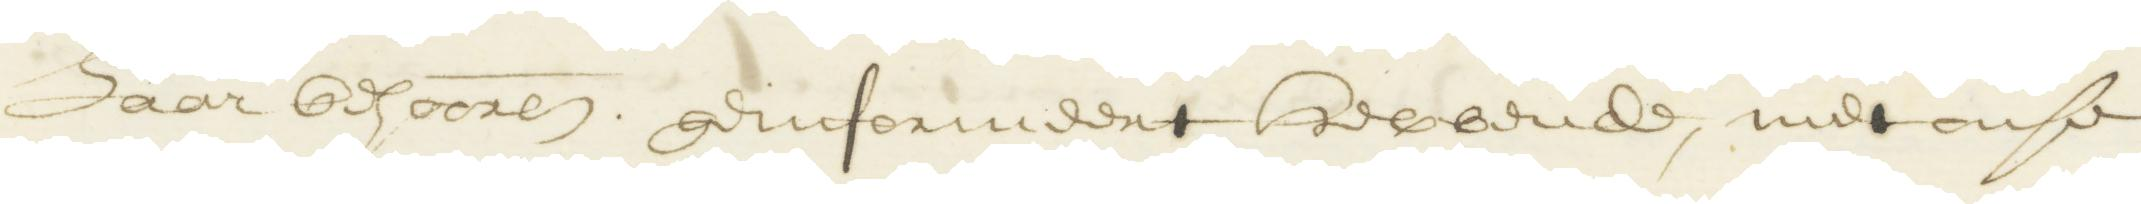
haar behoorlijk geinformeert hebbende, met onse
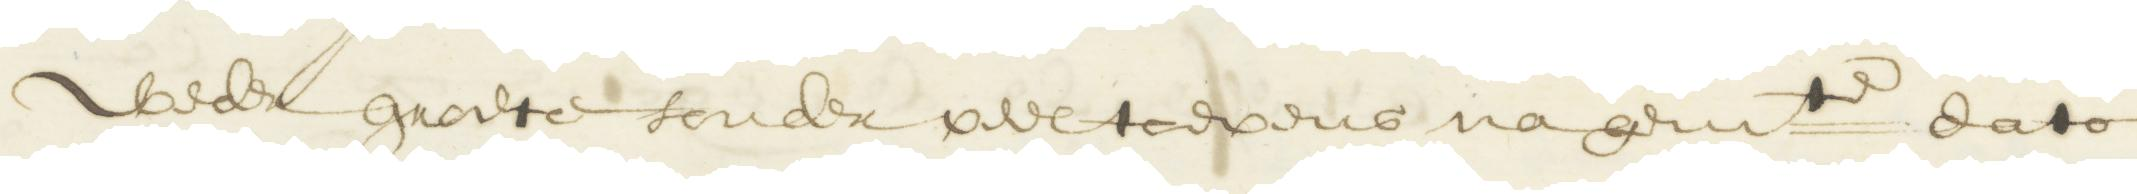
weder groete sonder veeltoevens na gem=te dato
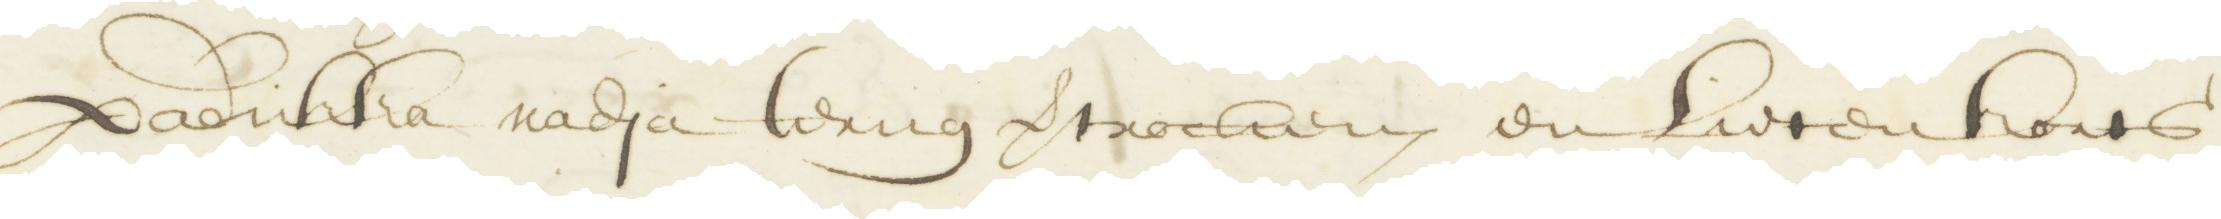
padukka radja terug vertrocken, en lieten korts
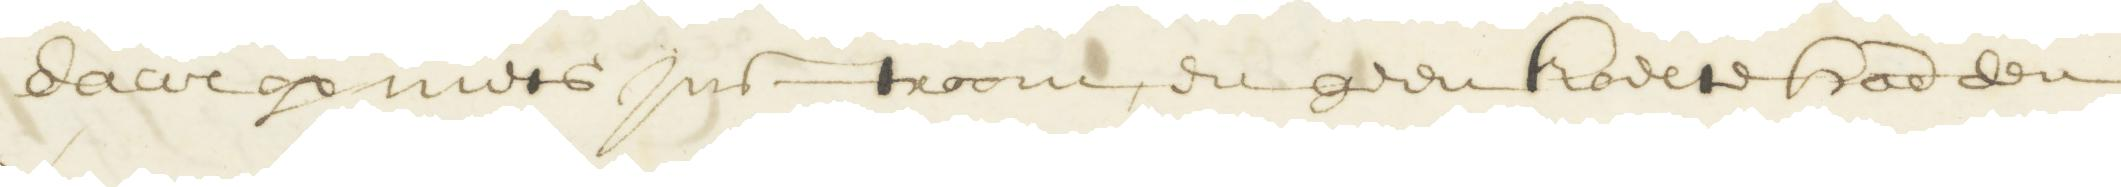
daar op niets jnstroom, en geen koelte hadden
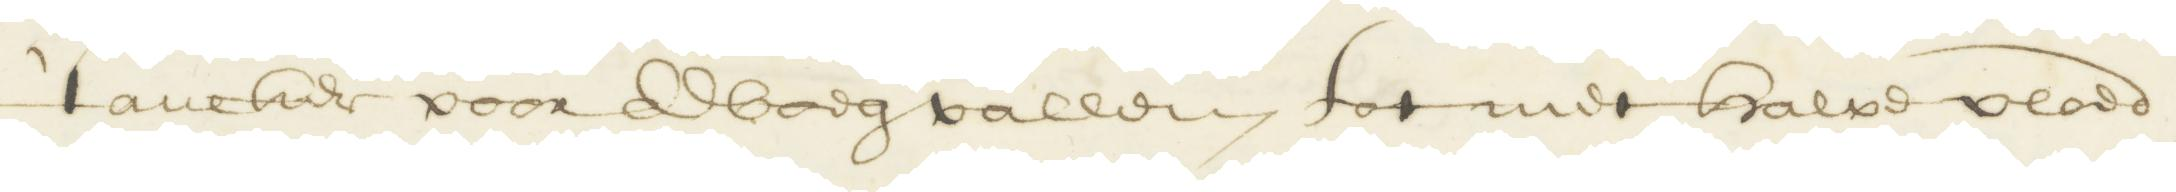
’t ancker voor deboegvallen, tot met halve vloed
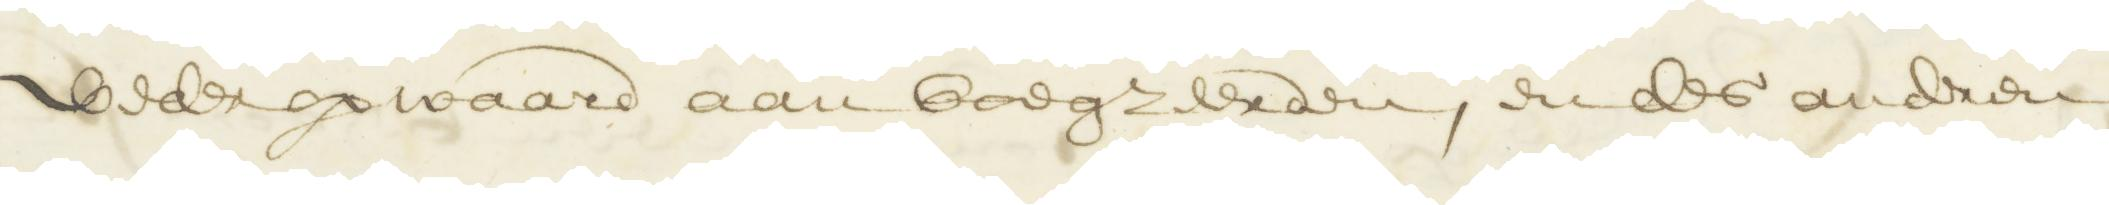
weder opwaard aan boegzeerden, en des anderen
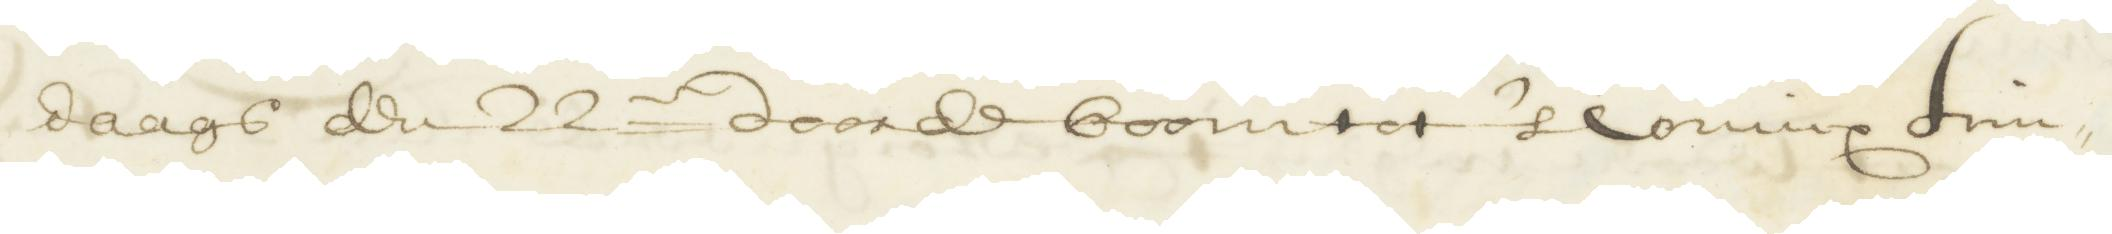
daags den 22=' door de boom tot 's Coninx tim„
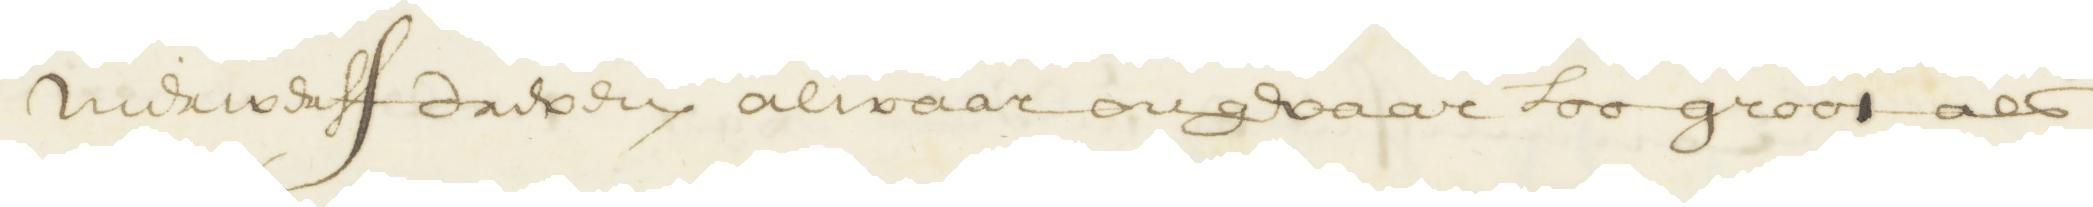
merwerff dreven, alwaar ongevaar soo groot als
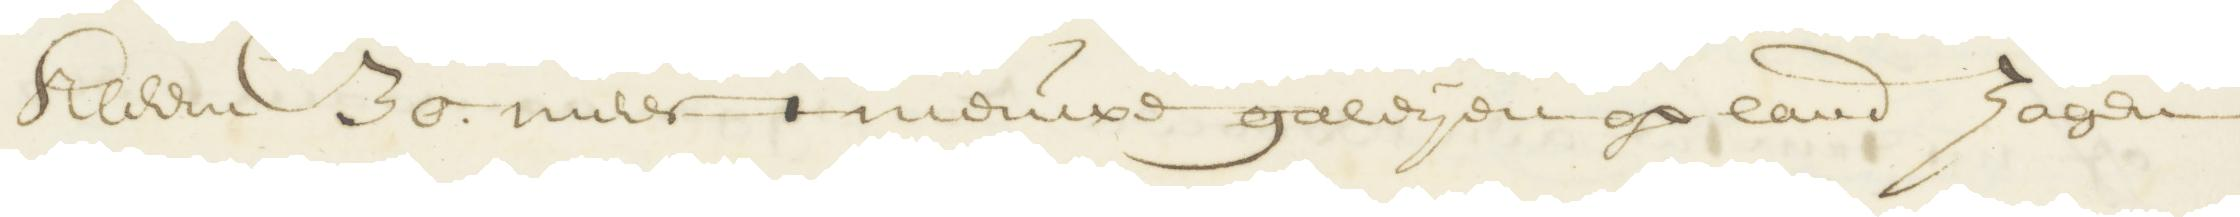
kleene 30. meest nieuwe galeijen op land zagen
